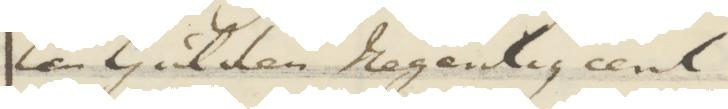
Een Gulden negentig cent
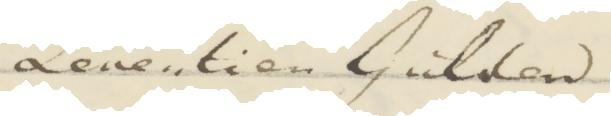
Zeventien Gulden
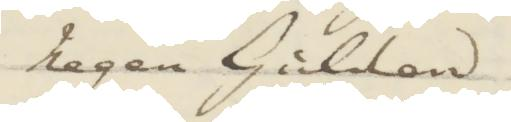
negen Gulden
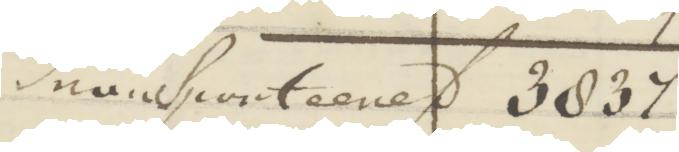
Transport eene ƒ 3837
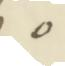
o
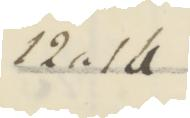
12„14
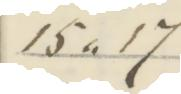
15„17
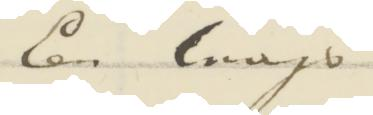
Een trap
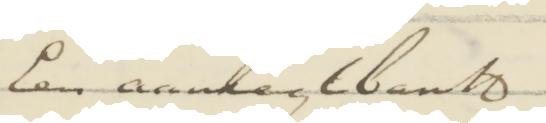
Een aanregtbank
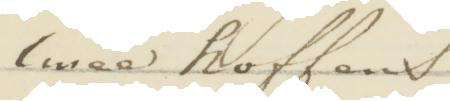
twee koffers
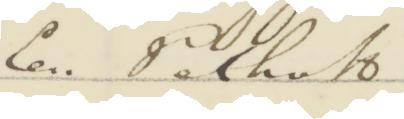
Een Vethuls
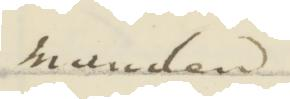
manden
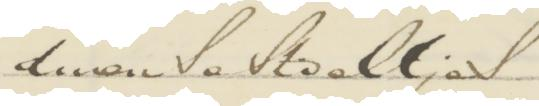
diwerse stoeltjes
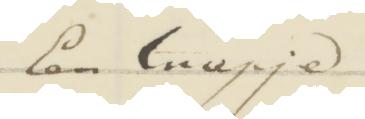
Een trapje
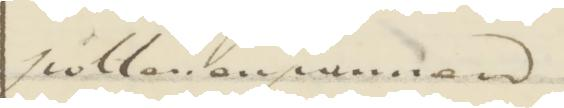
potten en pannen
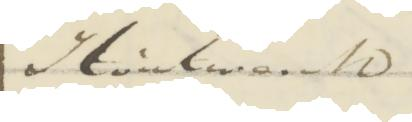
Houtwerk
